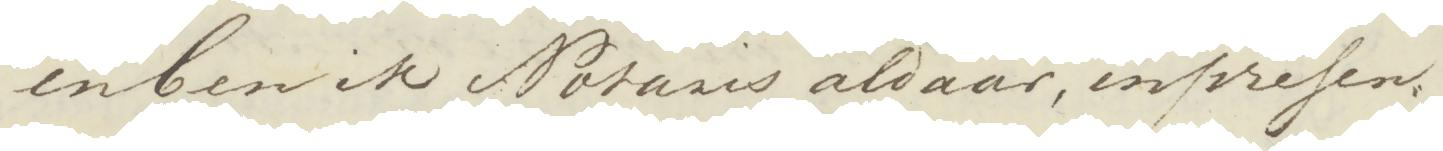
en ben ik Notaris aldaar, in presen:
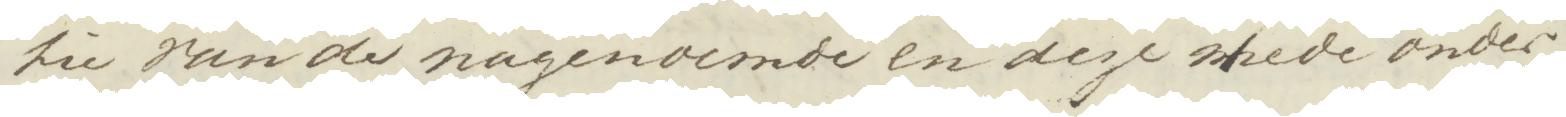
tie van de nagenoemde en deze mede onder:
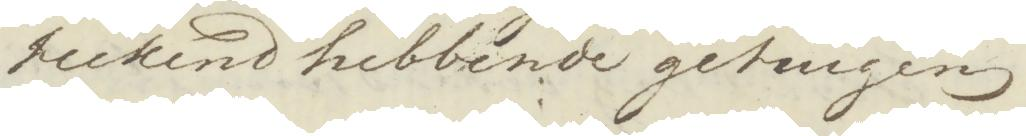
=teekend hebbende getuigen
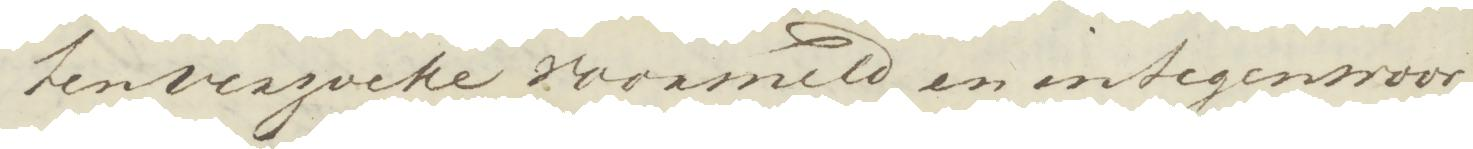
ten verzoeke voormeld en in tegenwoor:
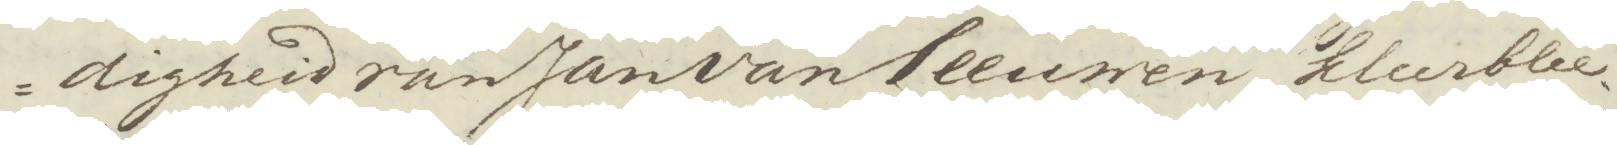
=digheid van Jan van Leeuwen, Kleerblee-
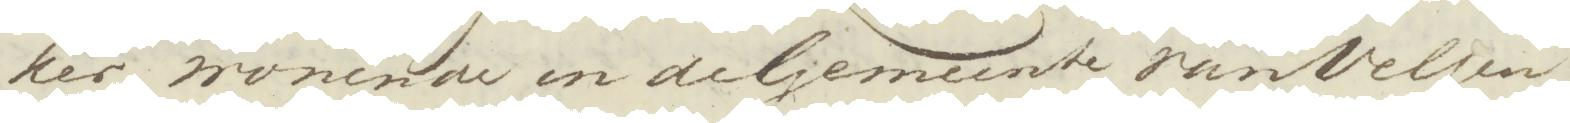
=ker, wonende in de Gemeente van Velsen,
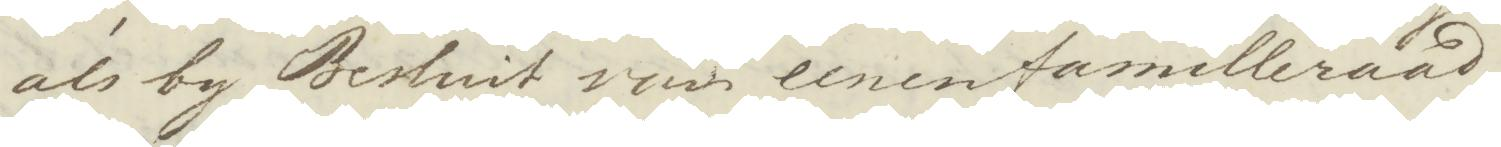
als by Besluit van eenen familleraad,
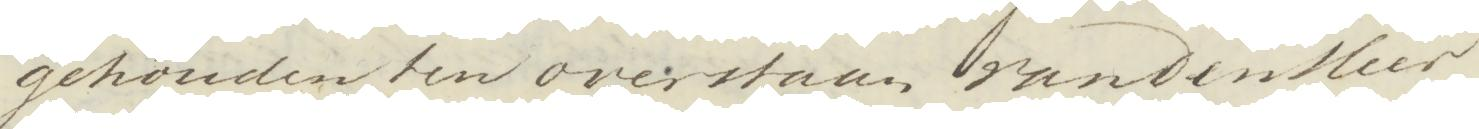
gehouden ten overstaan van den Heer
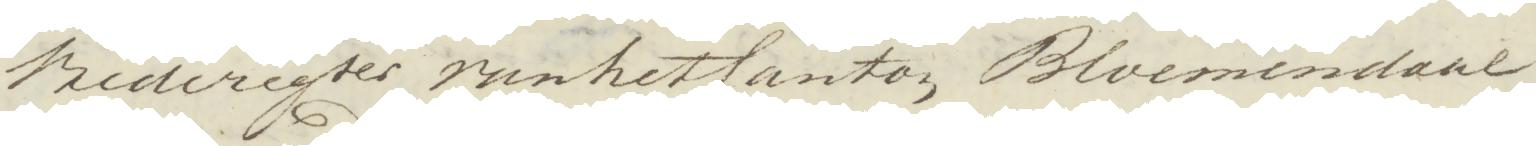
Vrederegter van het Canton Bloemendaal
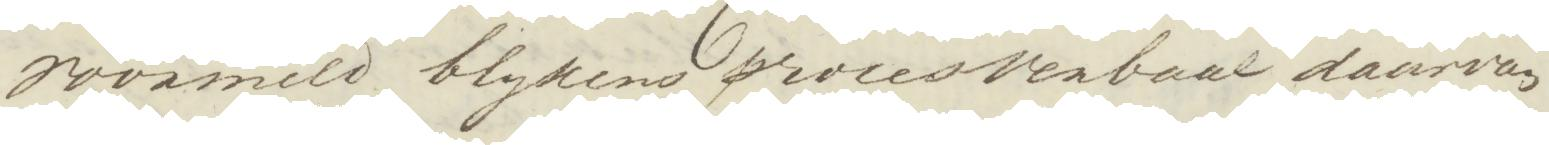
voormeld, blykens procesverbaal daarvan
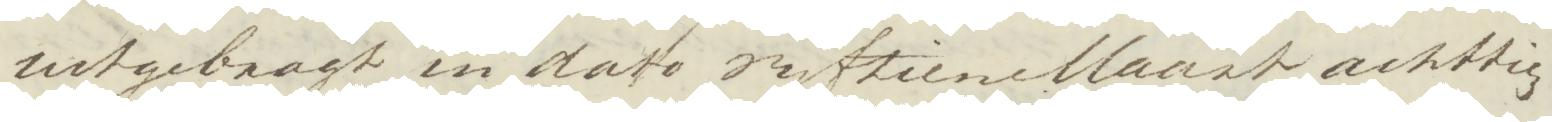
uitgebragt, in dato vyftien Maart achttien
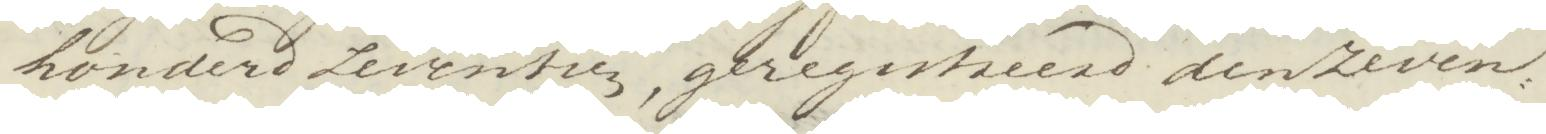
honderd zeventien, geregistreerd den zeven:
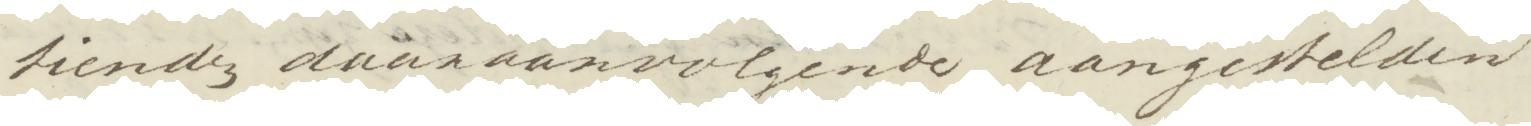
=tienden daaraanvolgende, aangestelden
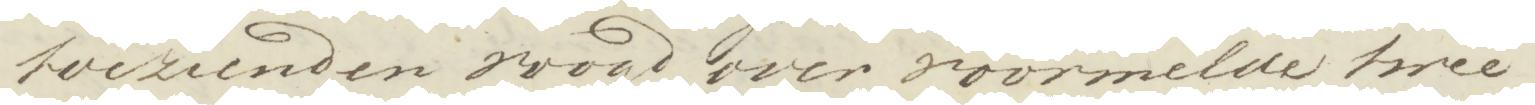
toezienden voogd over voormelde twee
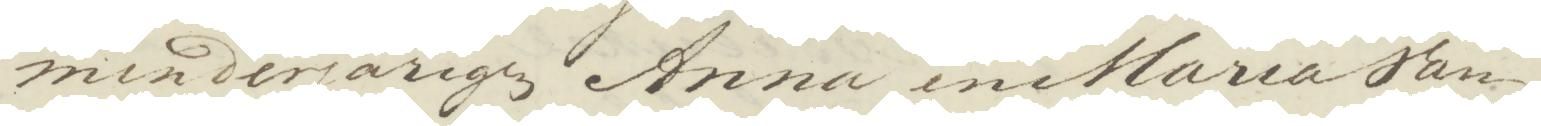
minderjarigen Anna en Maria Van
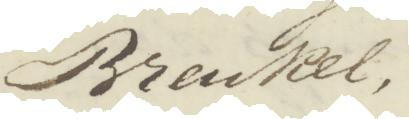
Breukel,
